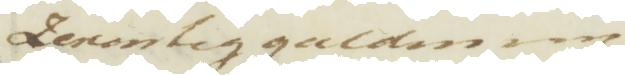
Zeventig guldens en
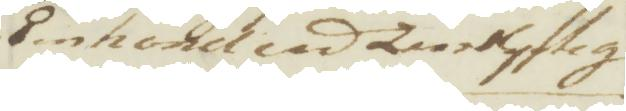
Een honderd zes & vyftig
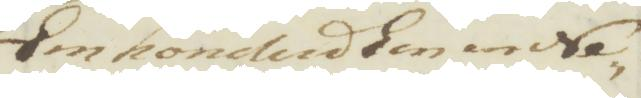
Een honderd Een en Ne„
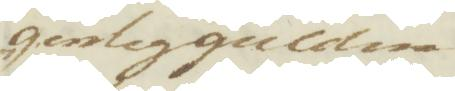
„gentig gulden
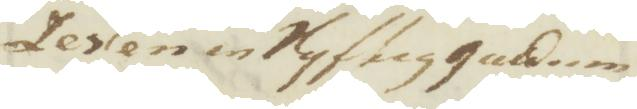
Zeven en Vyftig guldens
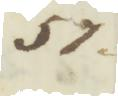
57.
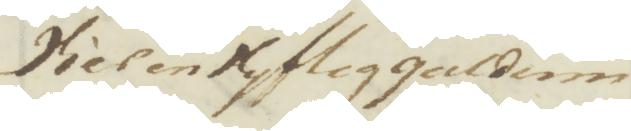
Vier en Vyftig guldens
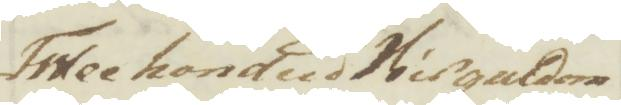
Twee honderd Vier guldens
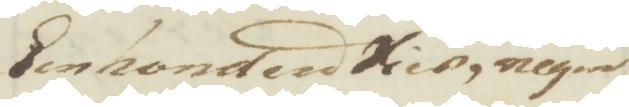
Een honderd Vier & negen
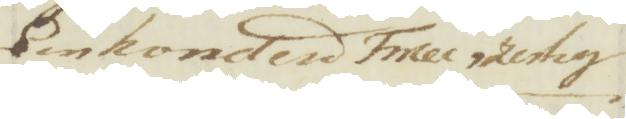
Een honderd Twee & zestig
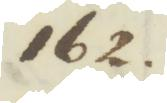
162.
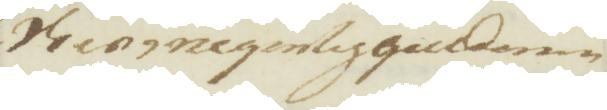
Vier & negentig guldens
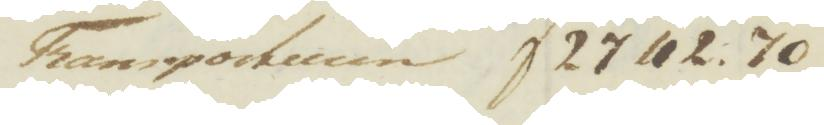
Transporteeren ƒ2742:70
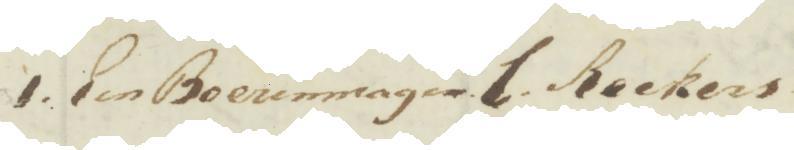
1. Een Boerenmagen. C. Reekers
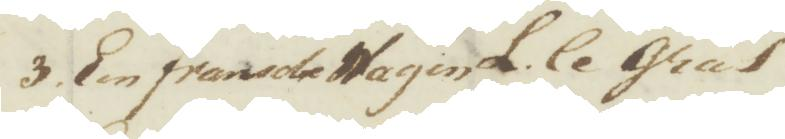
3. Een Fransche Wagen L. le Gras
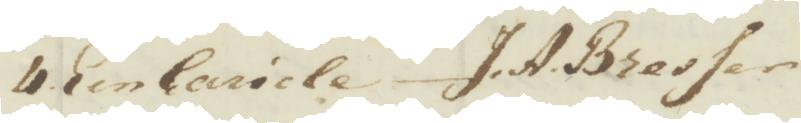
4. Een Caricle J. A. Bresser
